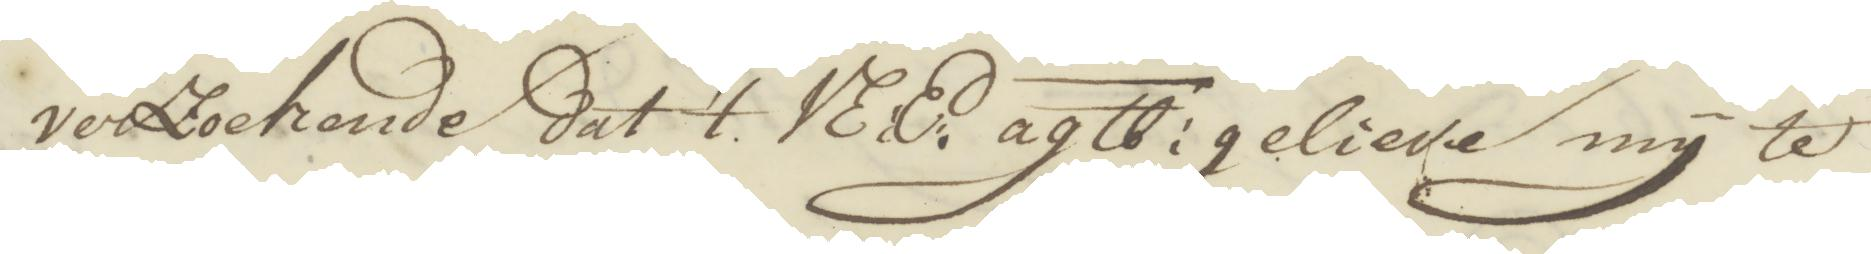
verzoekende dat 't VE: E: agtb: gelieve mij te
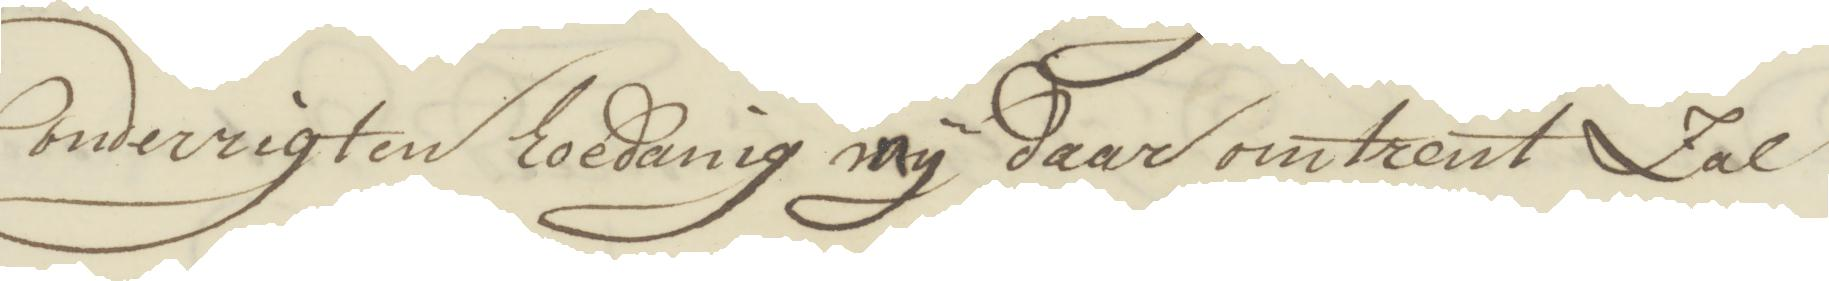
onderrigten hoedanig wij daar omtrent zal
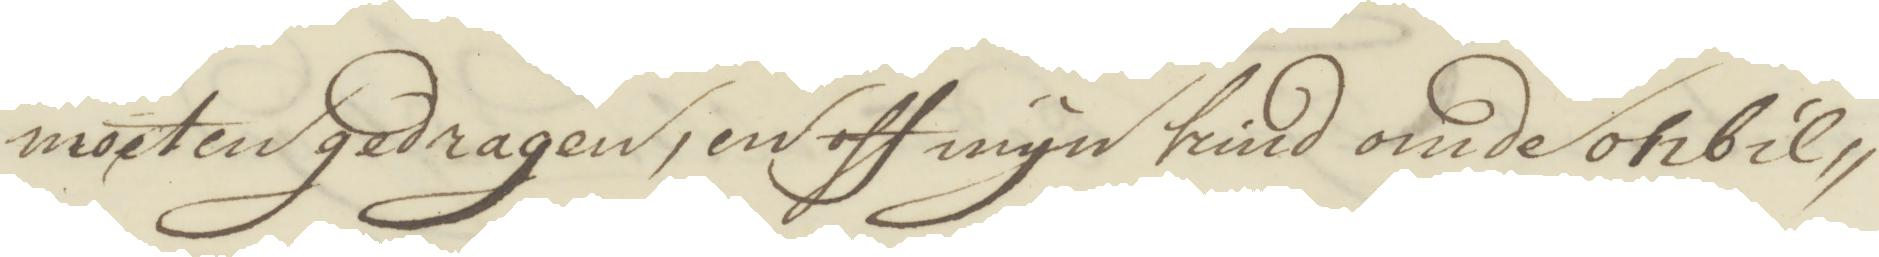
moeten gedragen, en off mijn kind om de onbil„
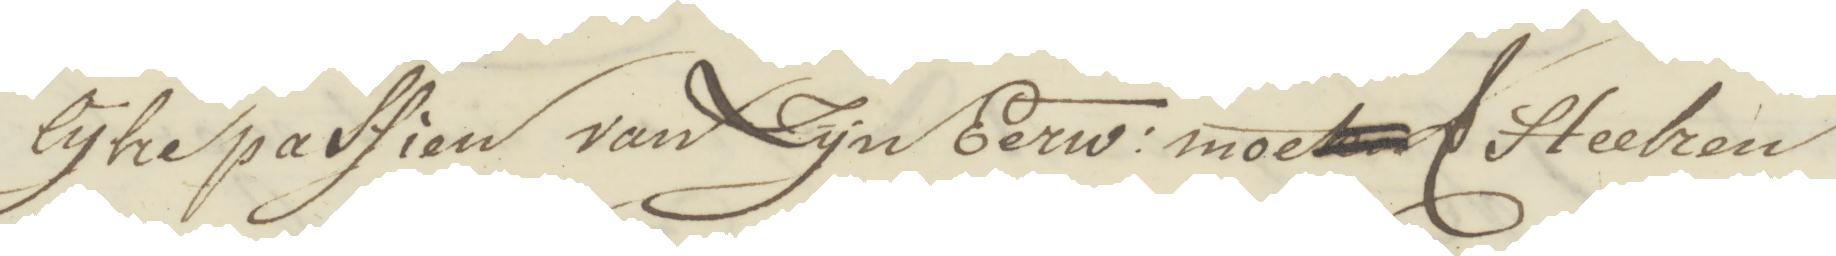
lijke passien van zijn Eerw: moet versteeken
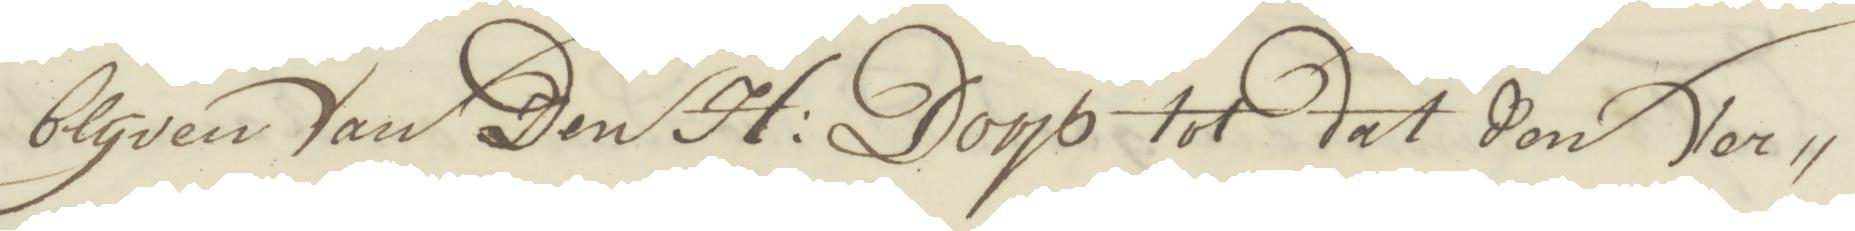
blijven van Den H: Doop tot dat den Ver„
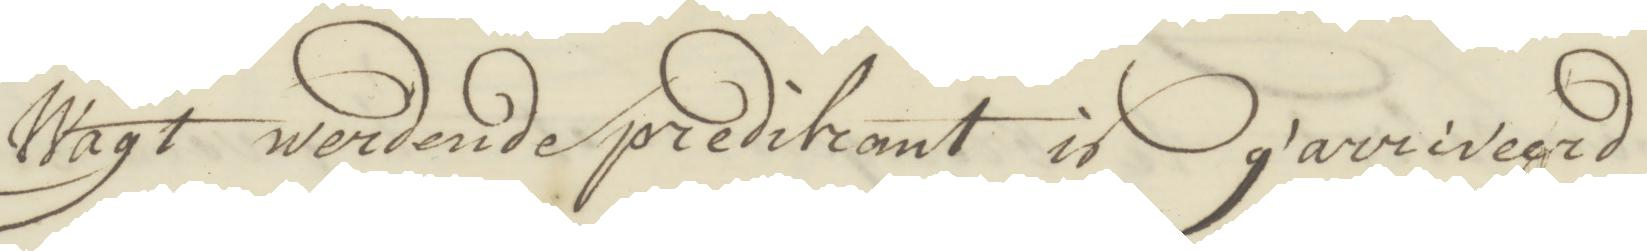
wagt werdende predikant is g'arriveerd
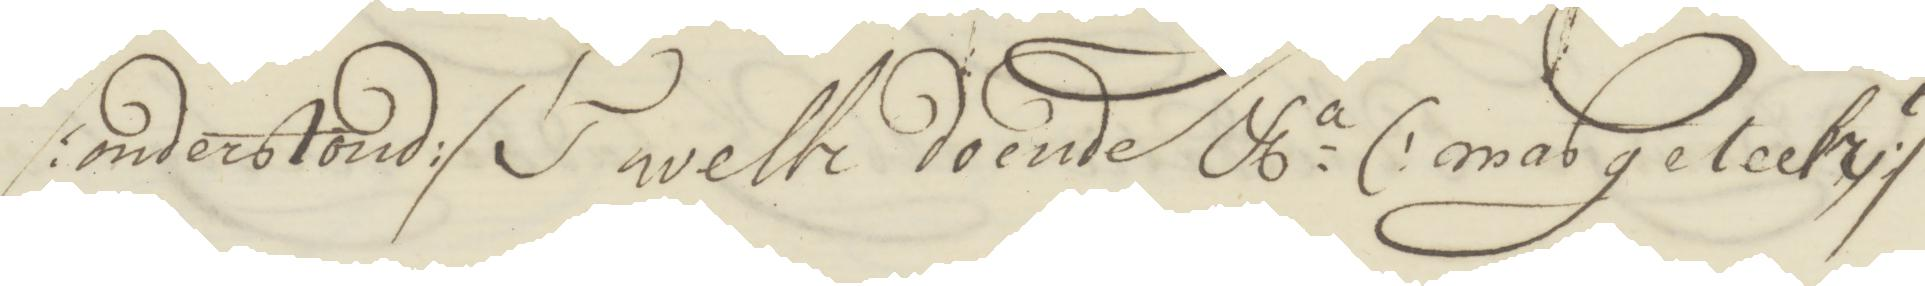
/:onderstond:/ 'T welk doende &=a /:was geteek;t/
